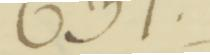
631.
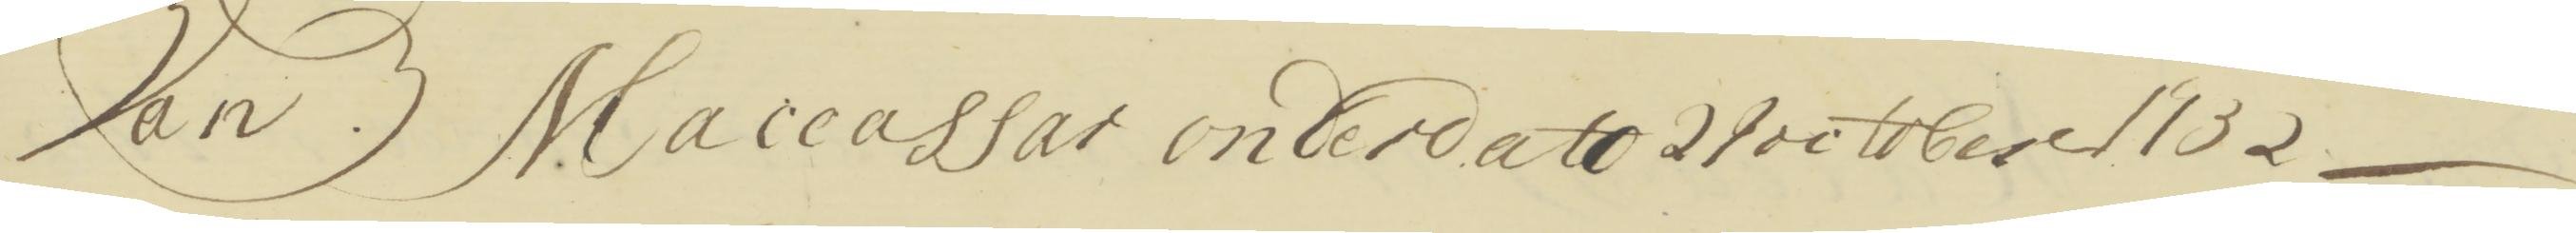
Van Maccassar onderdato 21 october 1732 —
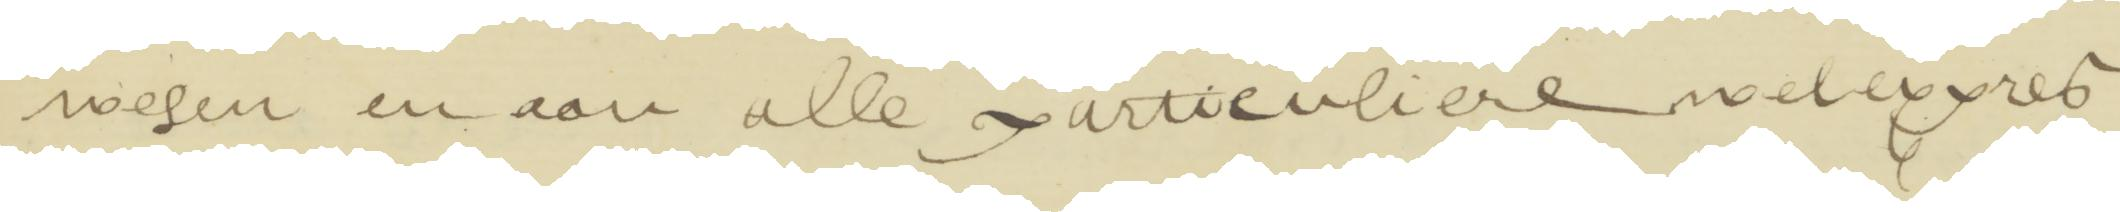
wesen en aan alle particuliere wel expres
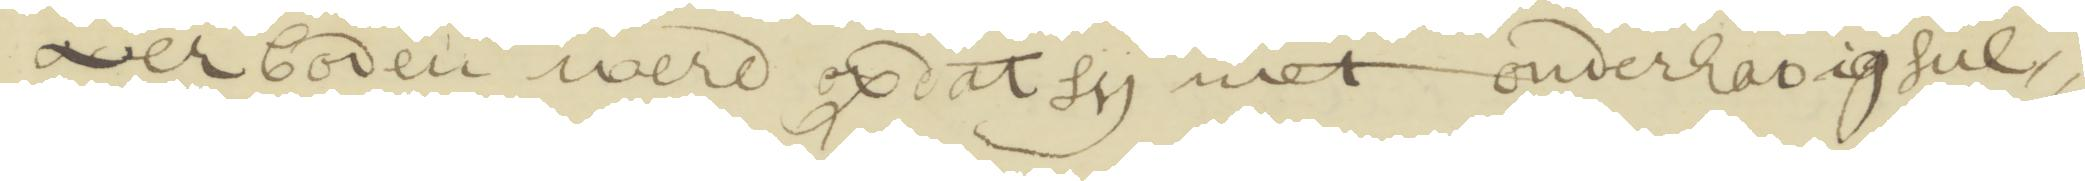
overboden werd op dat sij niet onderhavig sul„
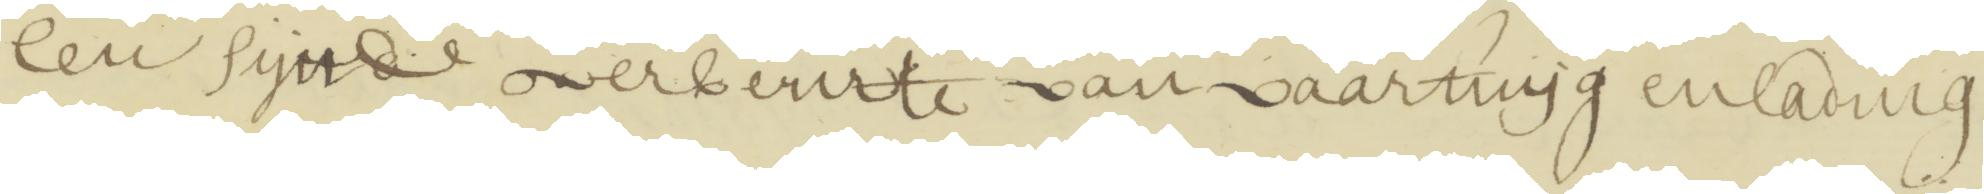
len sijn de verbeurte van vaartuijg enlading
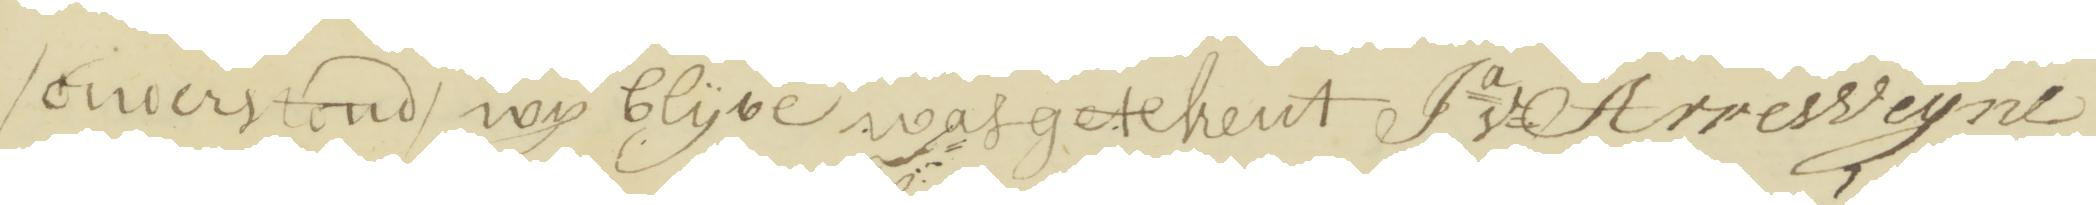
/onderstond/ wij blijve wat getekent I=n v= Arreweijne
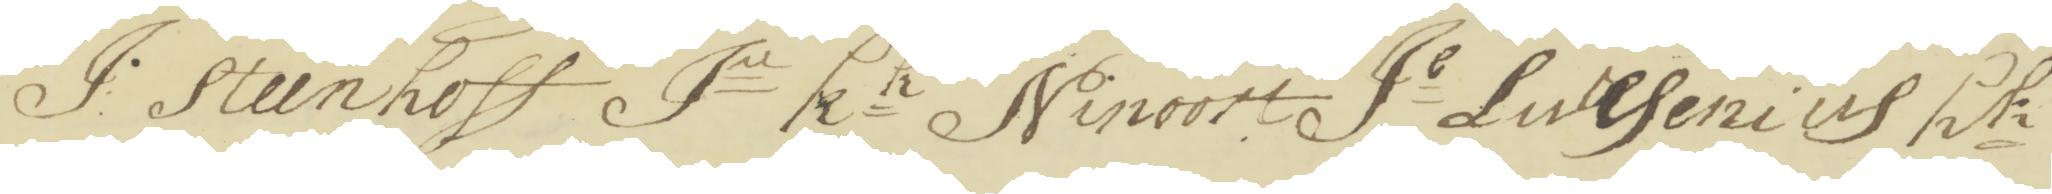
I: steenhoff I=n K=k Nipoort I=b Lursenius h=k
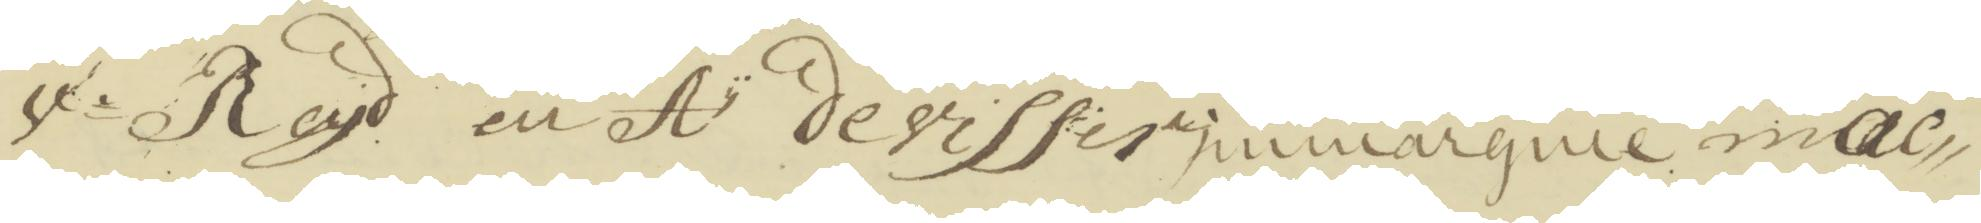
v= Reijd en Aij devisser /inmargine mac„
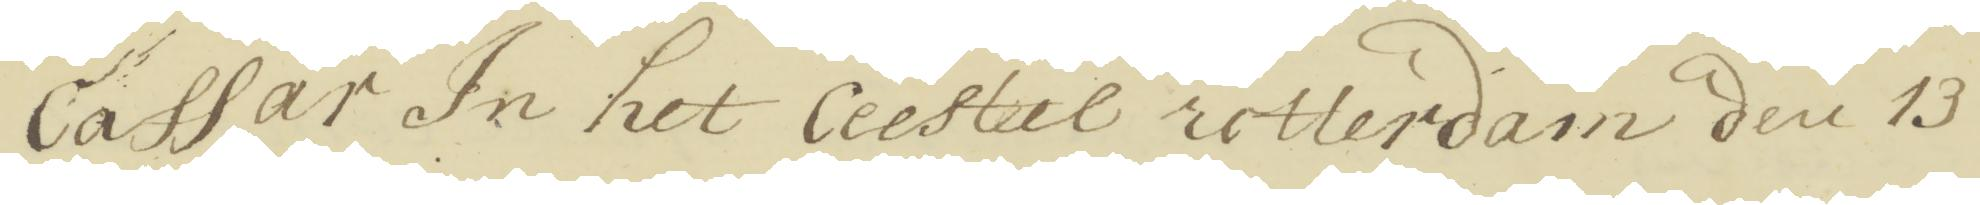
cassar In het casteel rotterdam den 13
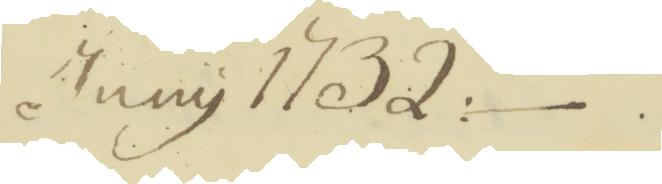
Iunij 1732:— .
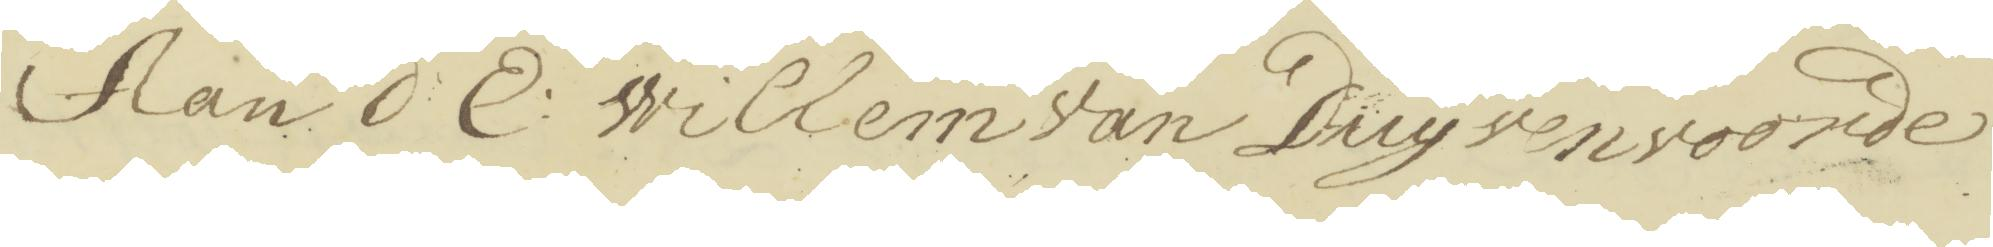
Aan d: E: willem van Duijvenvoorde
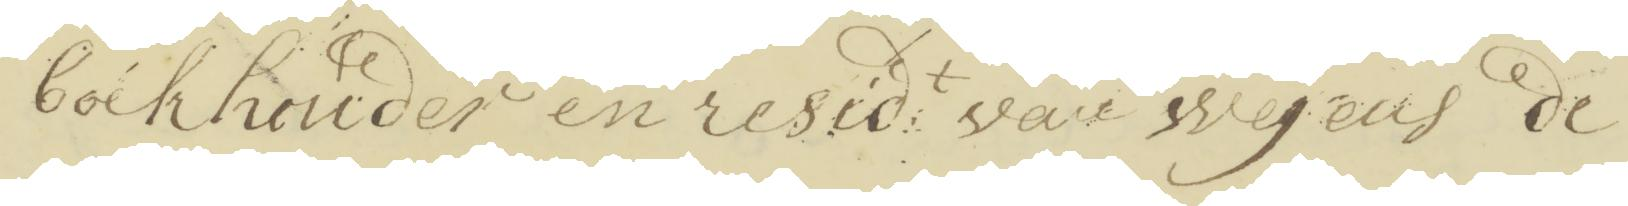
boekhouder en resid:t van wegens de
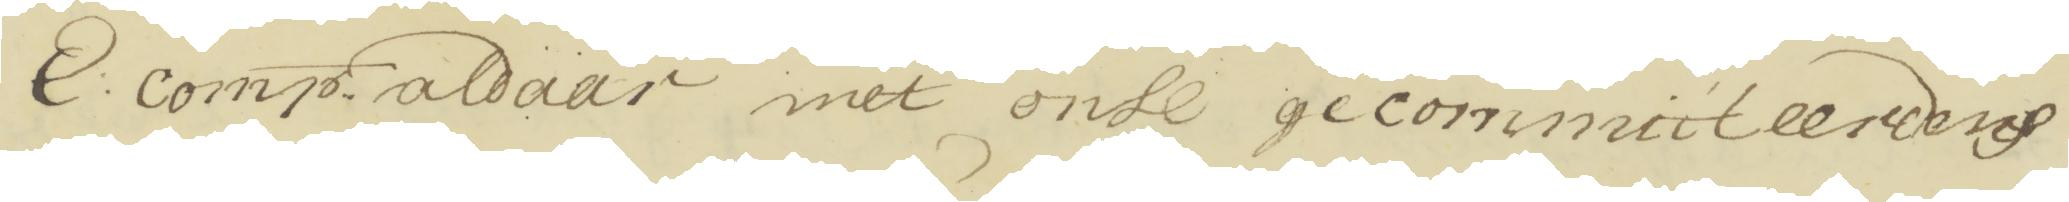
E: comp: aldaar met onse gecommitteerdens
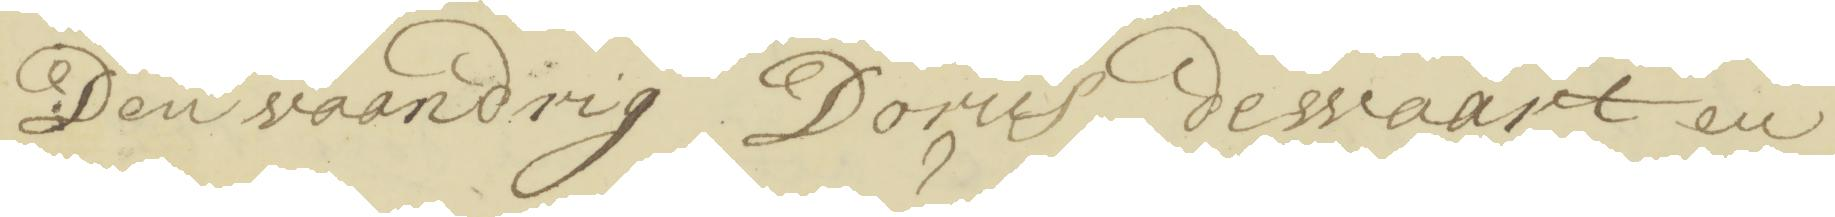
Den vaandrig Dorus dewaart en
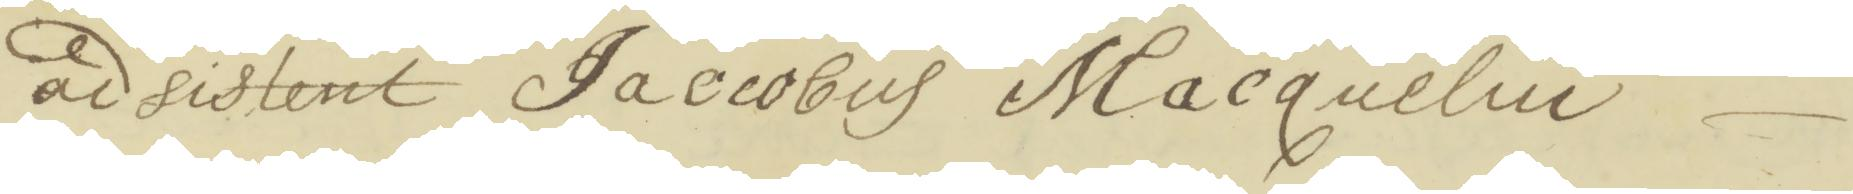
adsistent Jaccobus Macquelin —
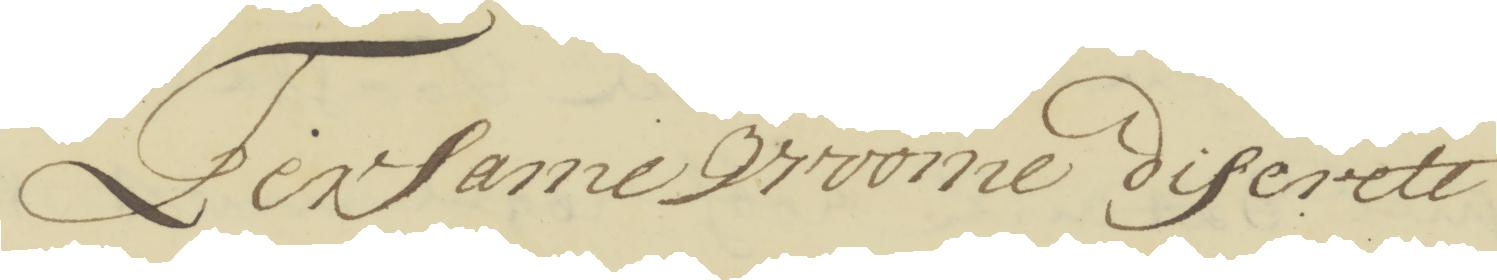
Eersame vroome discrete
